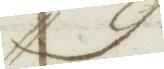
„ 9
